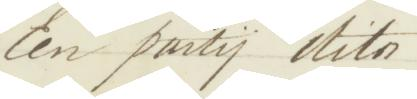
Een partij dito
